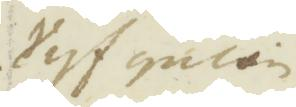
Vyf gulden
